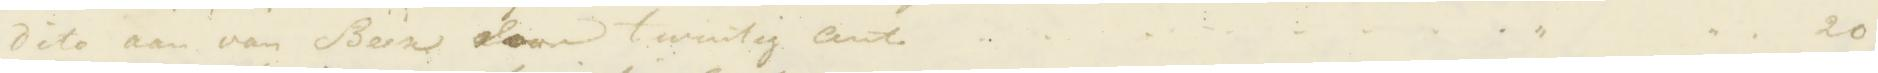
dito aan van Beek Sour twintig Cents „ „ 20
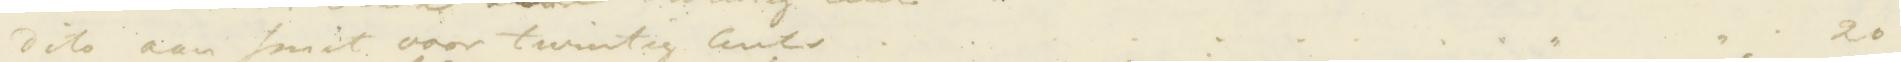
dito aan smit voor twintig Cents „ „ 20
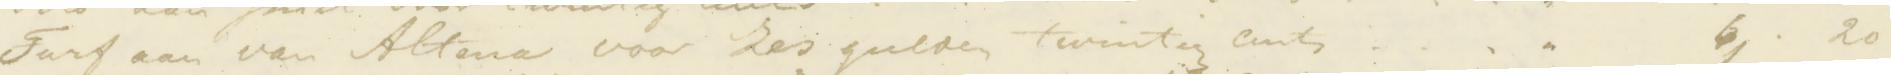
Garf aan van Altena voor zes gulden twintig cents „ 6.20
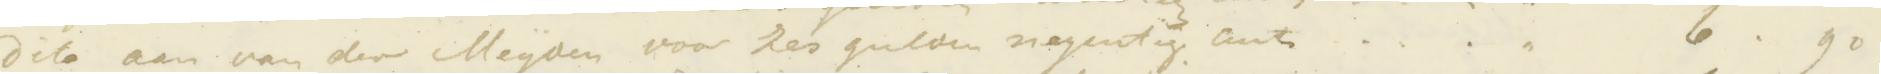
dito aan van der Meijden voor Zes gulden negentig Cent „ 6.90
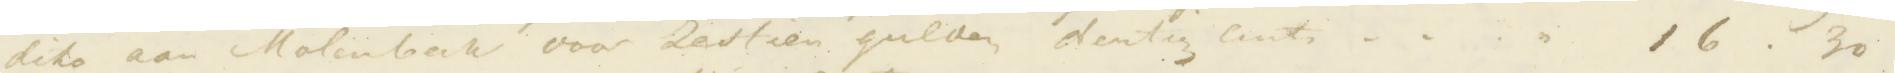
dito aan Molenbak voor Zestien gulden dentig Cents „ 16.30
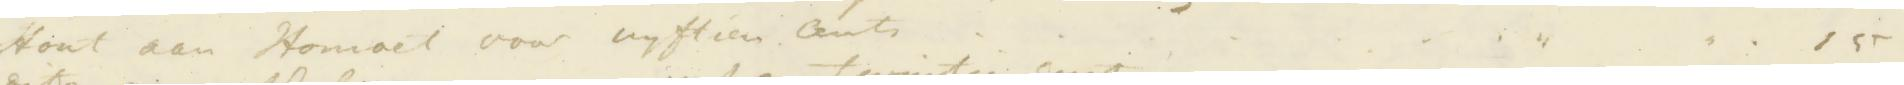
Hout aan Homoet voor vijftien Cents „ „.15
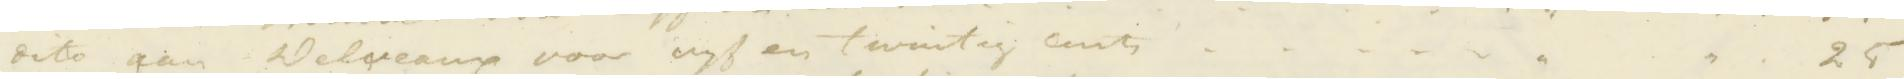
dito aan Delveaux voor vijf en twintig cents „ „.25
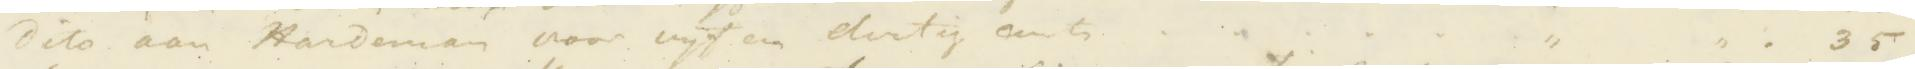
dito aan Hardeman voor vijf en dertig cents „ „.35
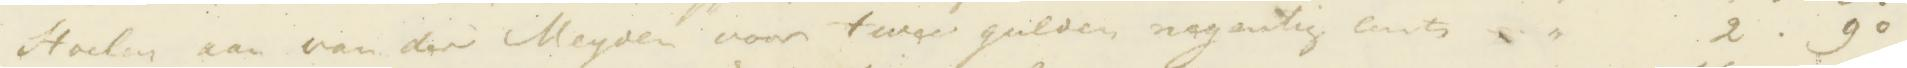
Stoelen aan van der Meijden voor twee gulden negentig Cents „ 2.90
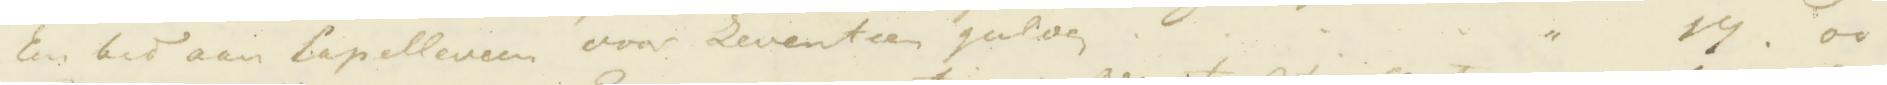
Een bed aan bapelleveen voor Zeventien gulden „ 17.00
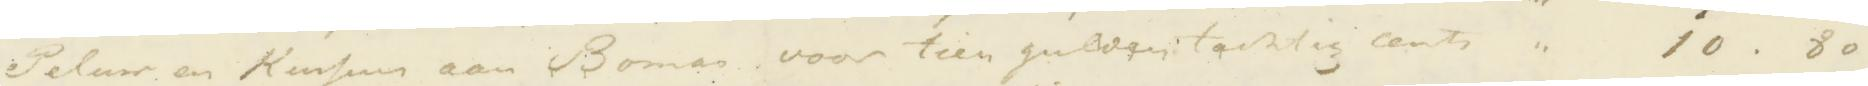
Teluw en Kussens aan Bomas voor tien gulden tachtig cents „ 10.80
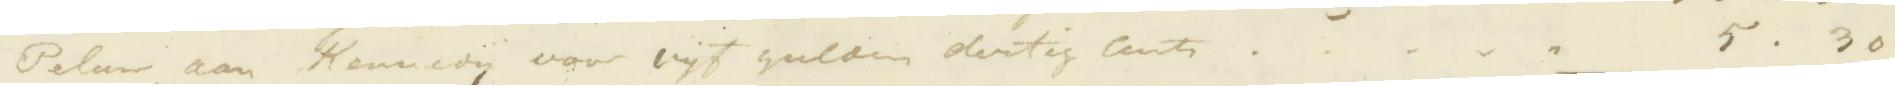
Pelan aan Kenuedij voor vijf gulden dertig Cents „ 5.30
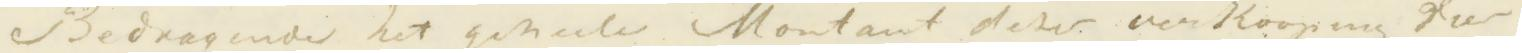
Bedragende het geheele Montant, dezer verkooping Vier
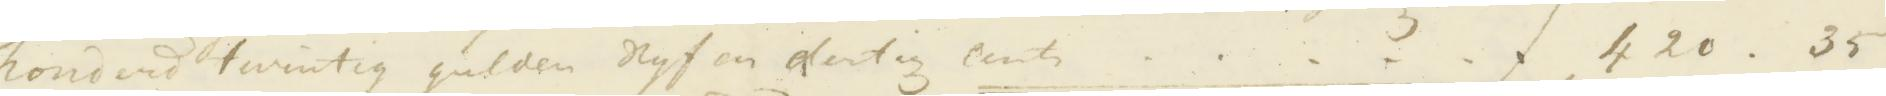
honderd twintig gulden Vijf en dertig cents ƒ 420.35
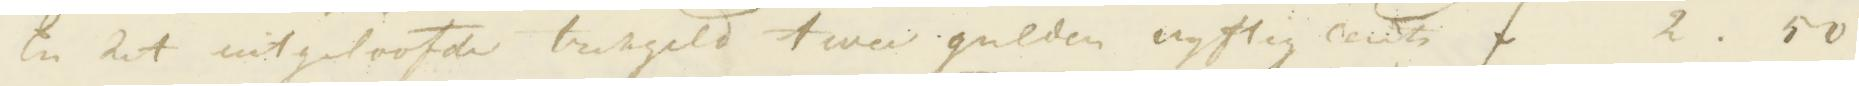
En zet uitgeloofde trekgeld twee gulden vijftig Cents ƒ 2.50
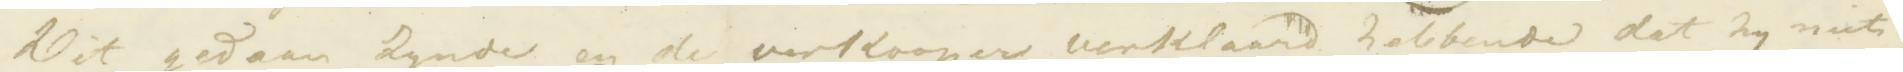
Dit gedaan zijnde en de verkooper verklaard hebbende dat hij niets
